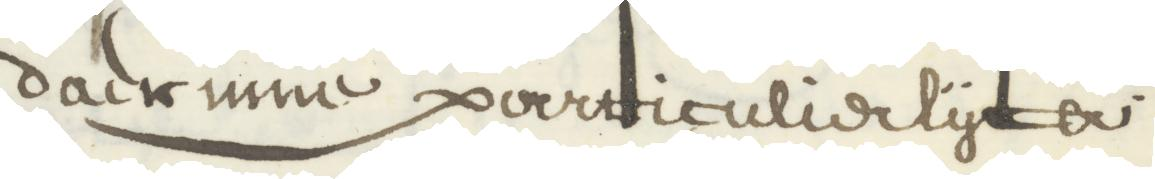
daer inne particulierlijck
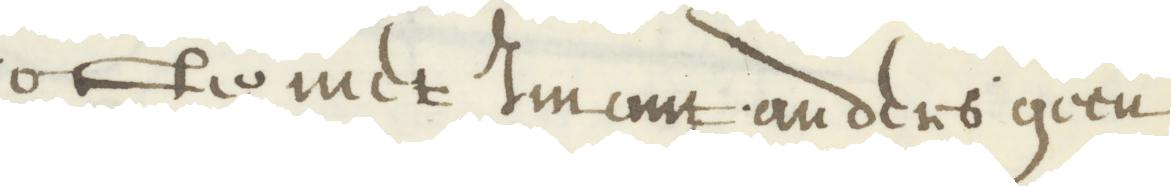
offe met Imant anders geen
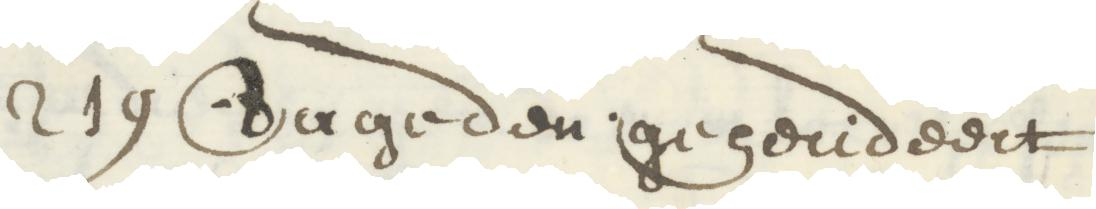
219 Pagoden gerendeert
